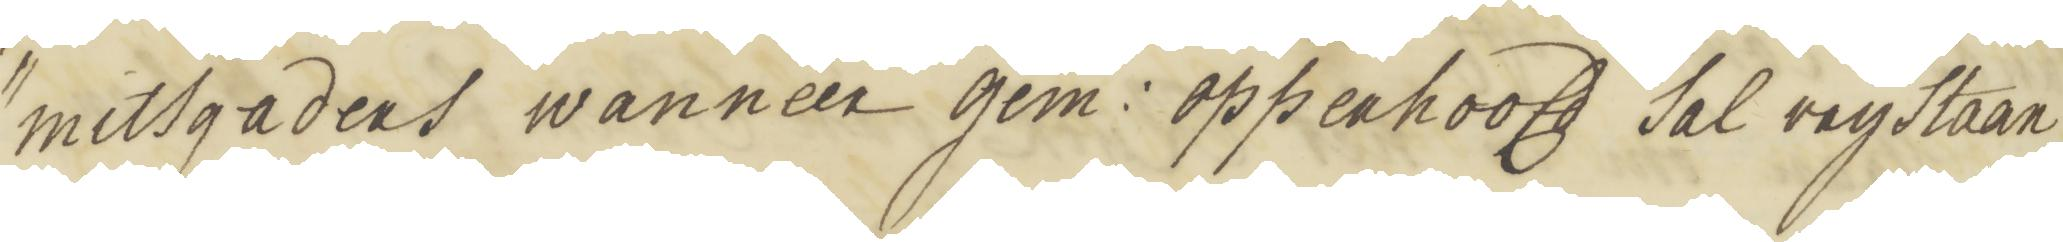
mitsgaders wanneer gem: opperhoofd sal vrijstaan
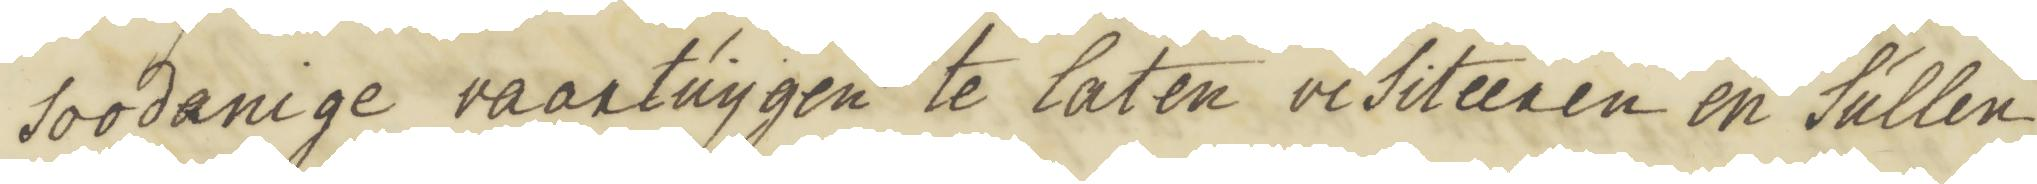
soodanige vaartuijgen te laten visiteeren en sullen
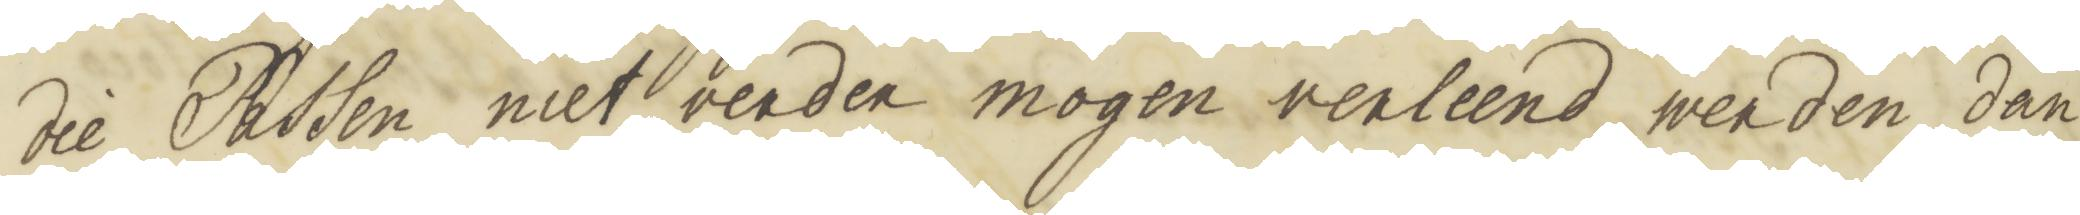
die Passen niet verder mogen verleend werden dan
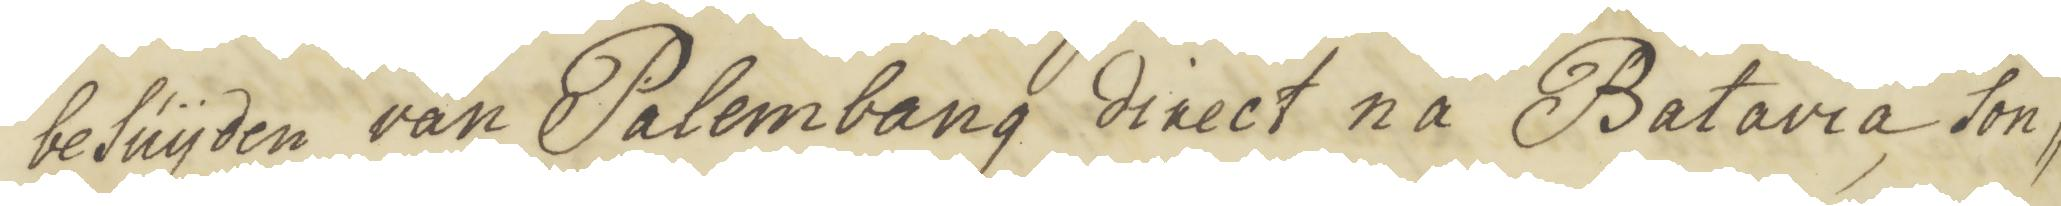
besuijden van Palembang direct na Batavia son„
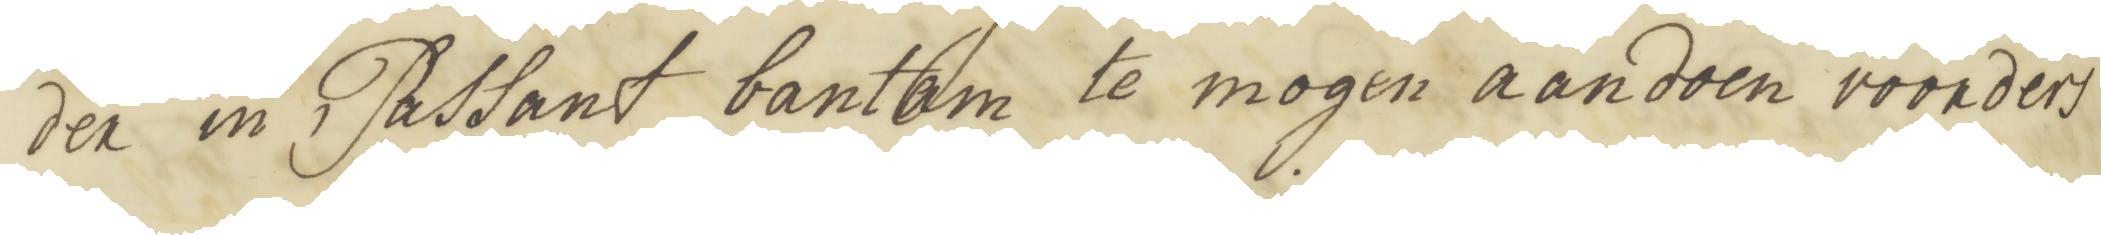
der in Passant bantam te mogen aan doen voorders
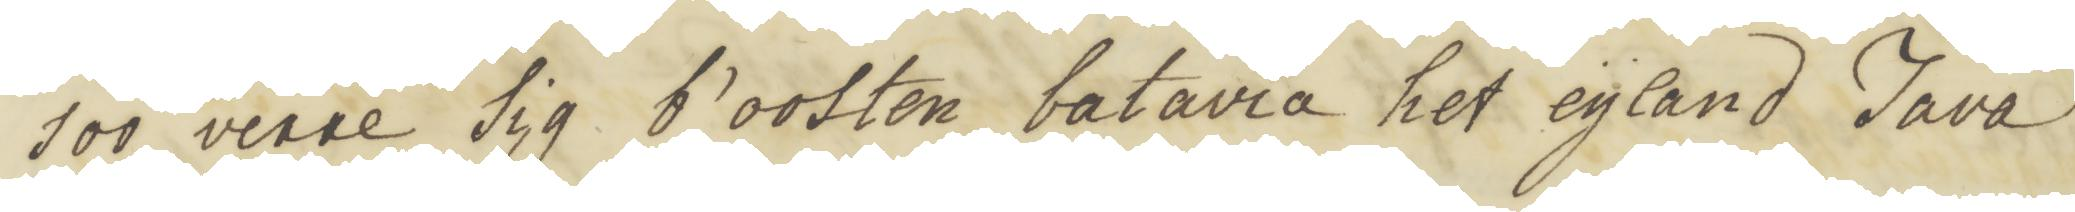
soo verre sig b’oosten batavia het eijland Iava
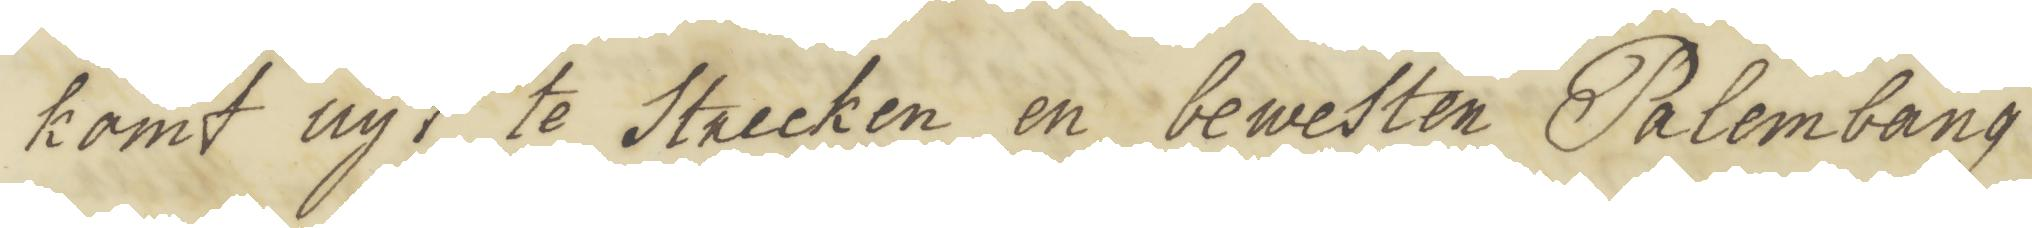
komt uijt te strecken en bewesten Palembang
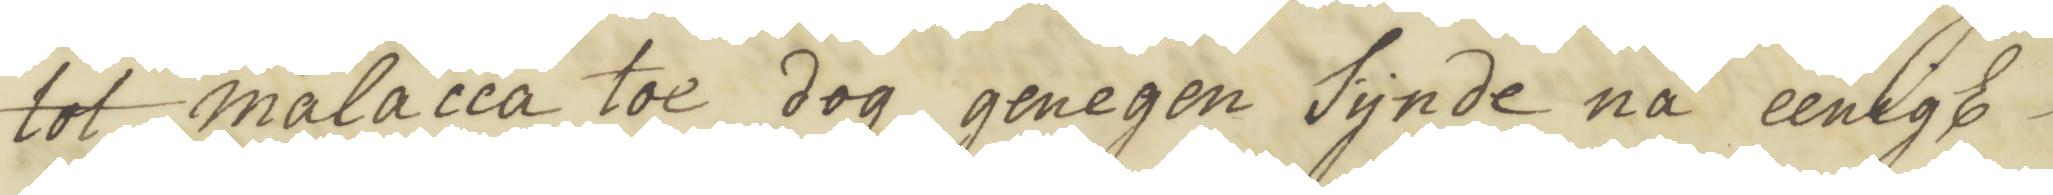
tot malacca toe dog genegen sijnde na eenigh
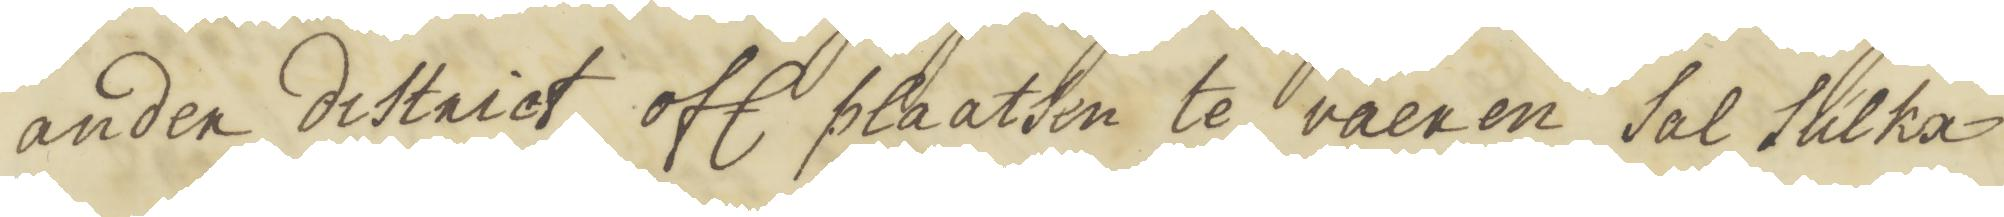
ander district off plaatsen te vaeren sal sulkx
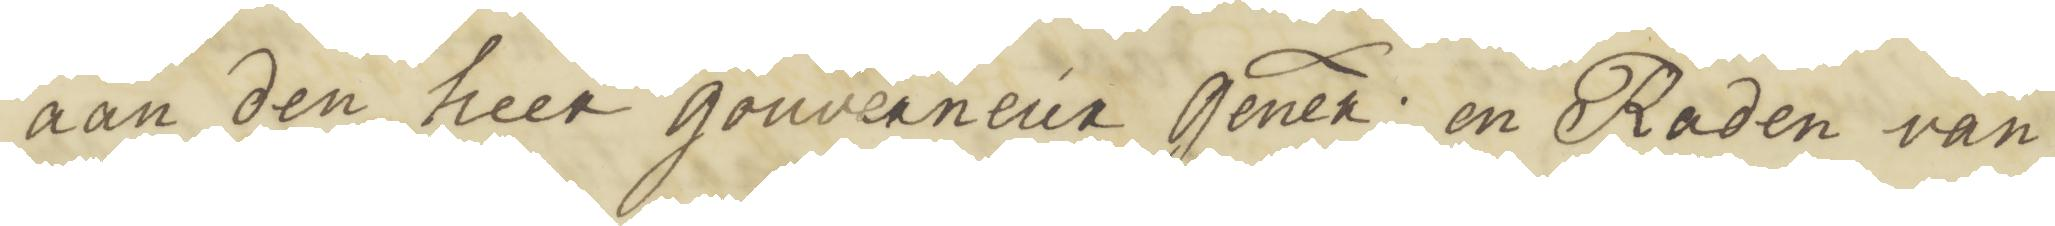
aan den heer gouverneur Gener: en Raden van
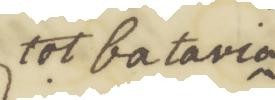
tot batavia ^
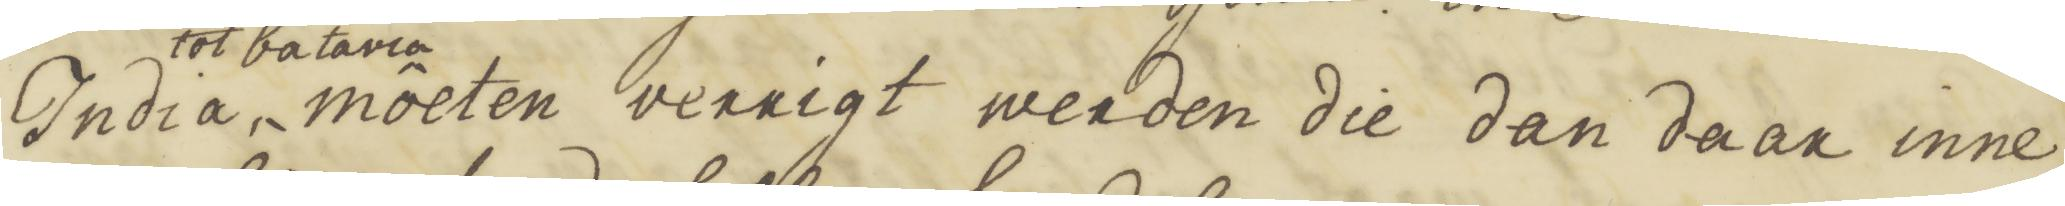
India ^ moeten verrigt werden die dan daar inne
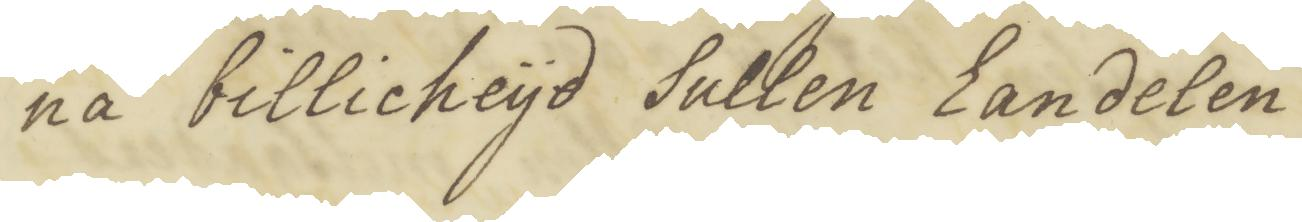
na billicheijd sullen handelen
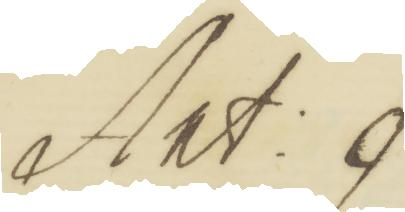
Art: 9
